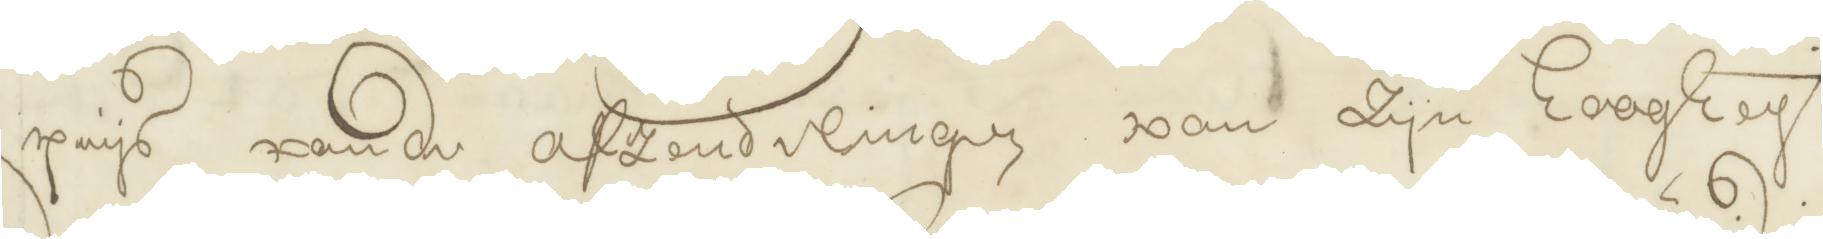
prijs van de afzendelingen van zijn hoogheijt
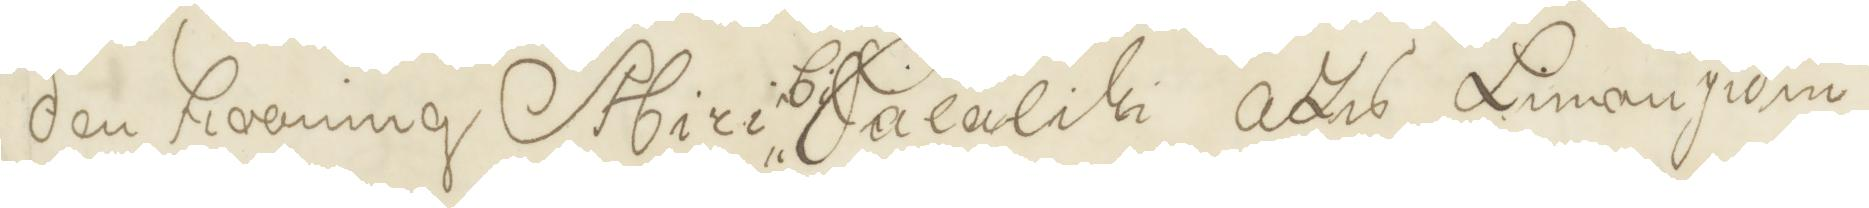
den kooning Miri„bi falalihi azis Limaujidin
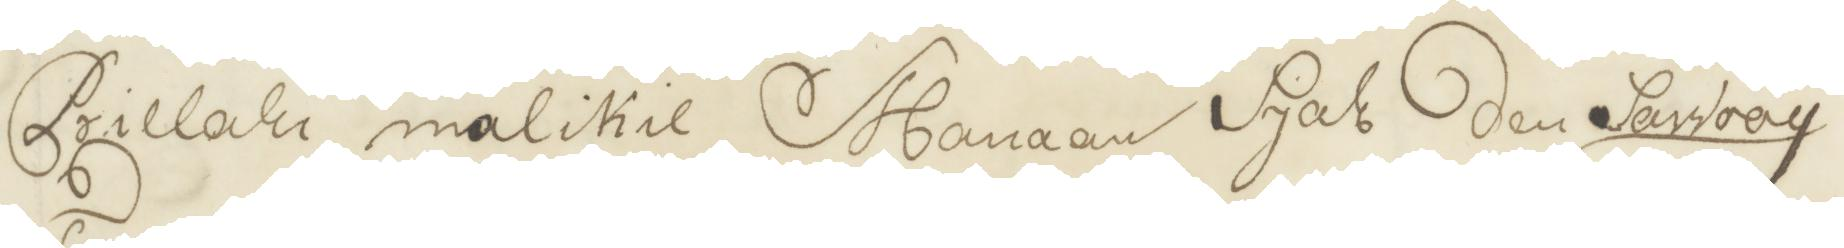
Prillahi malikie Manaan Sjah den Sawooij
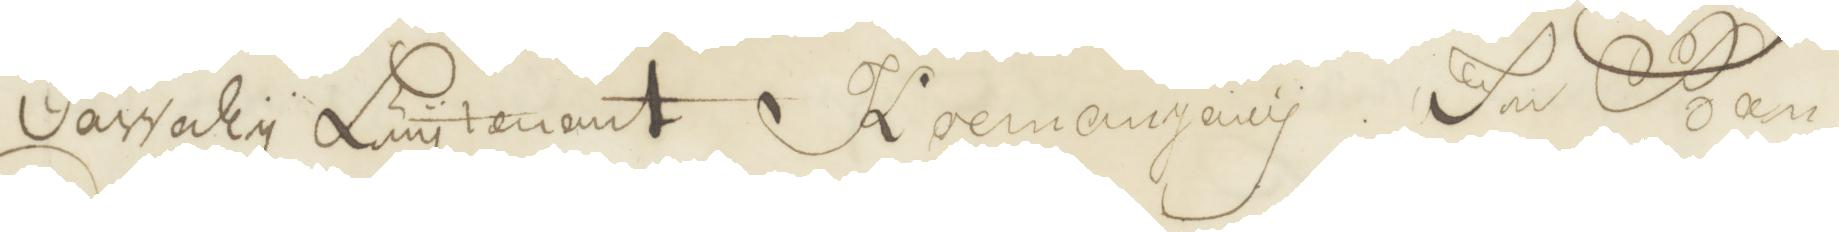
Tawahij Luijtenant Koemanjanij. En Ban
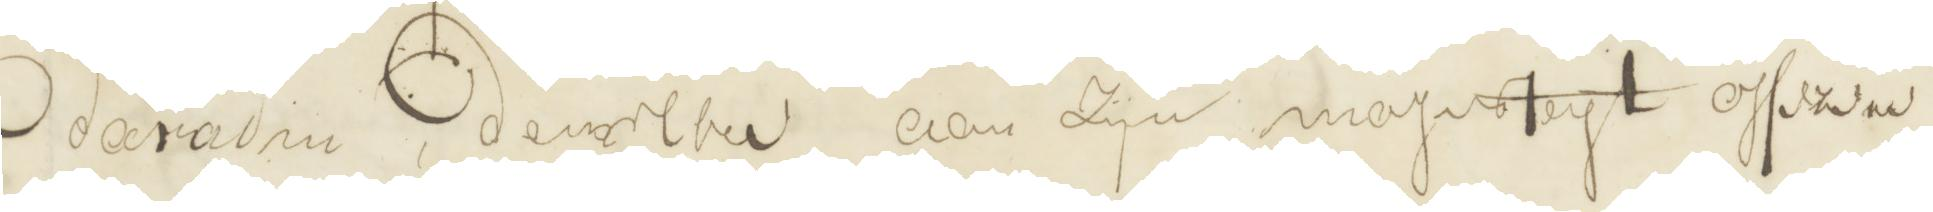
daradin, dewelke aan zijn majesteijt offerere
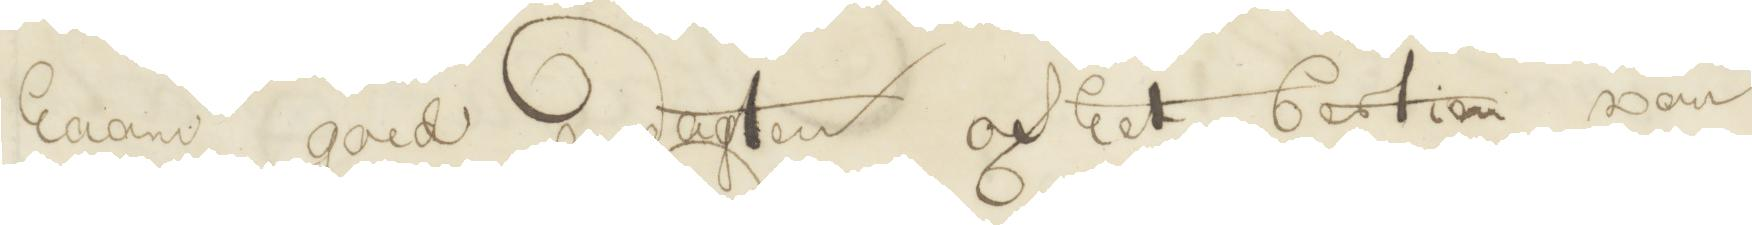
haare goede gedagten over het bestier van
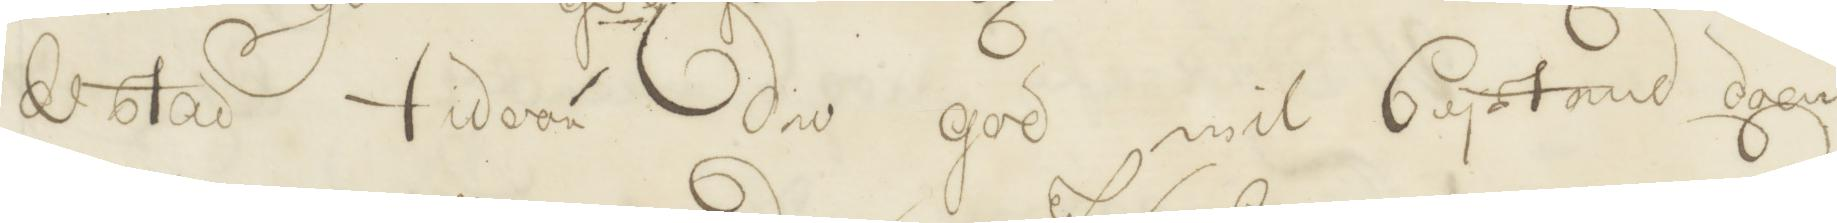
de stad Tidoor die god mit bijstand doen
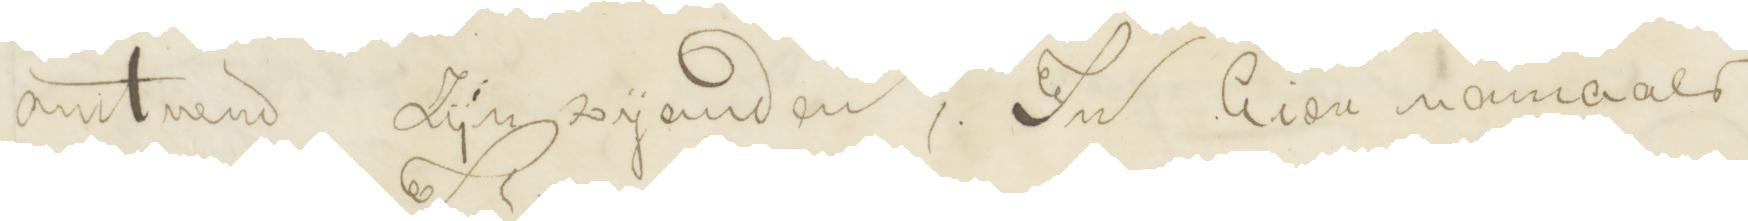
omtrend zijn vijanden, En hier namaals
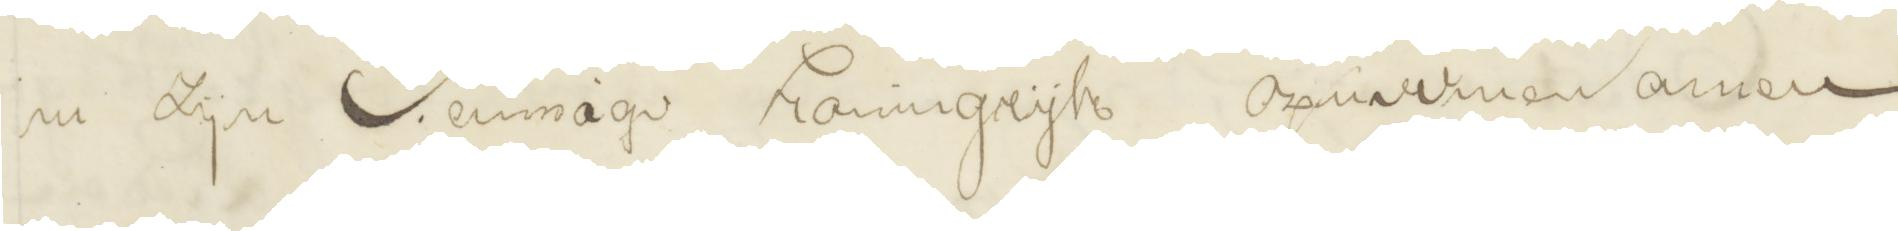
in zijn Eeuwige koningrijk opneemen amen
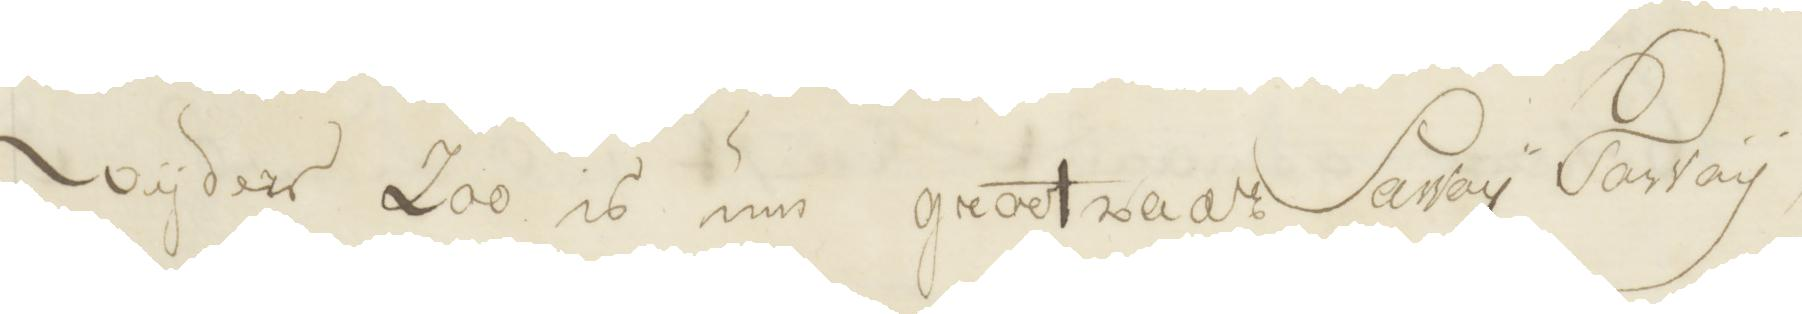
wijders zoo is uw groot vaar Sawaij Tawaij,
